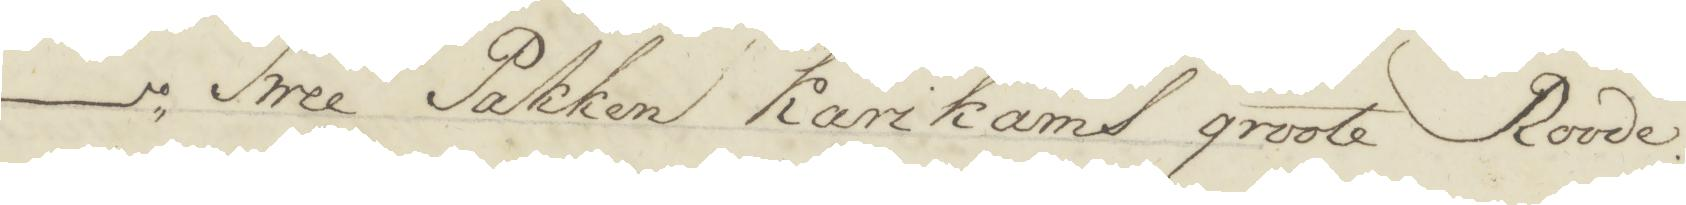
_„o Twee Pakken karikams groote Roode.
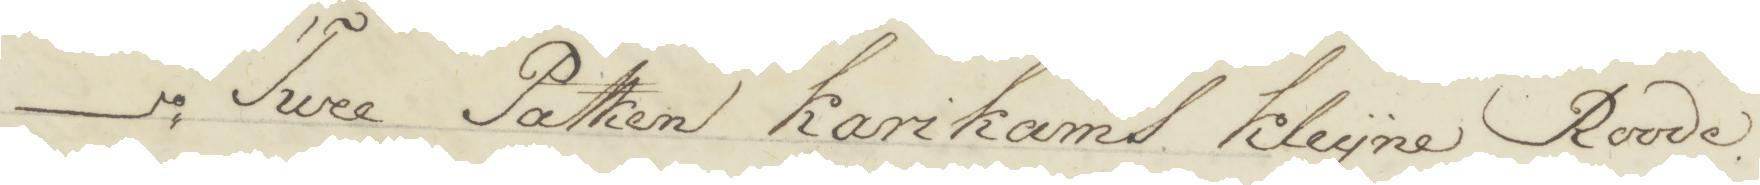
_„o Twee Pakken karikams kleijne Roode.
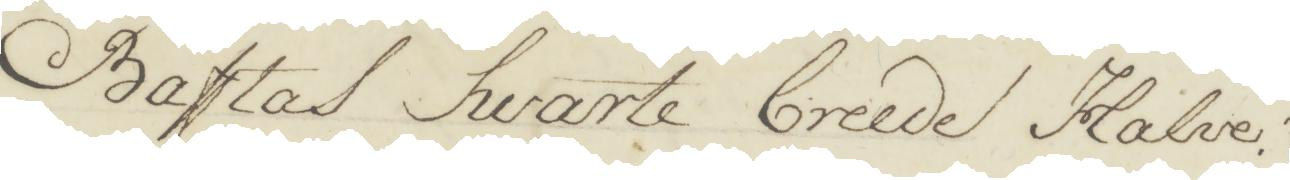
Bafftas Swarte breede Halve.
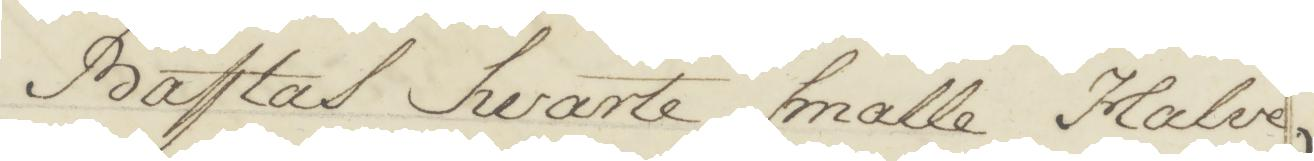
Bafftas Swarte smalle Halve
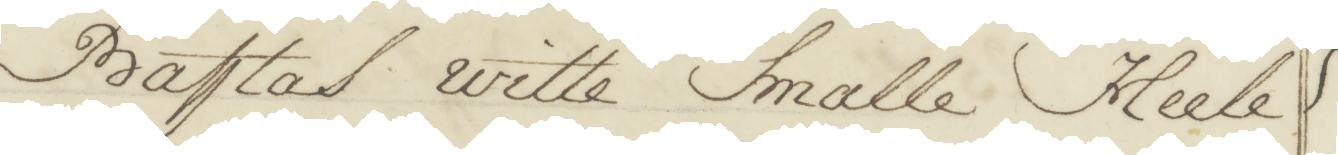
Bafftas witte smalle Heele
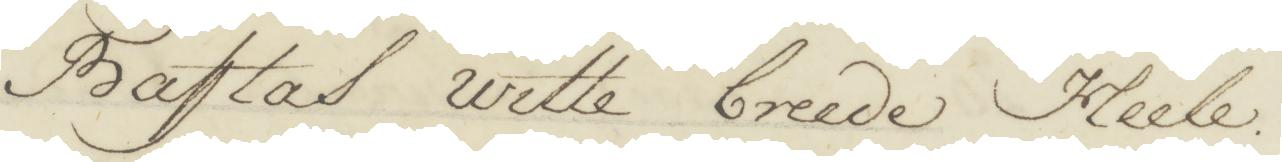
Bafftas witte breede Heele.
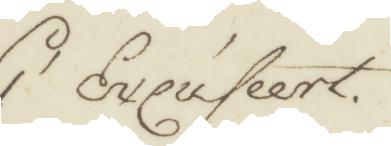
G' Excuseert.
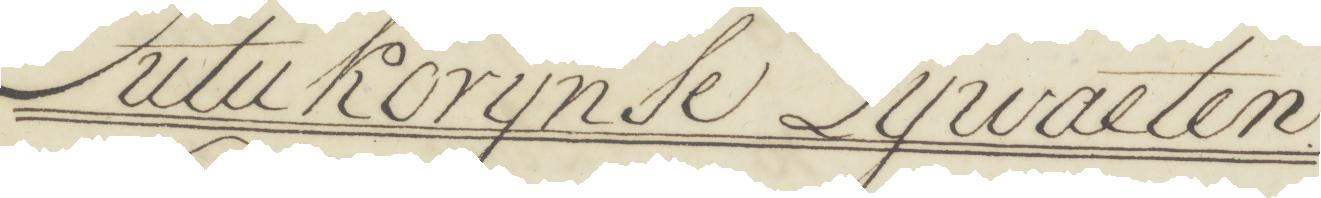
'Tutukorijnse Lijwaeten
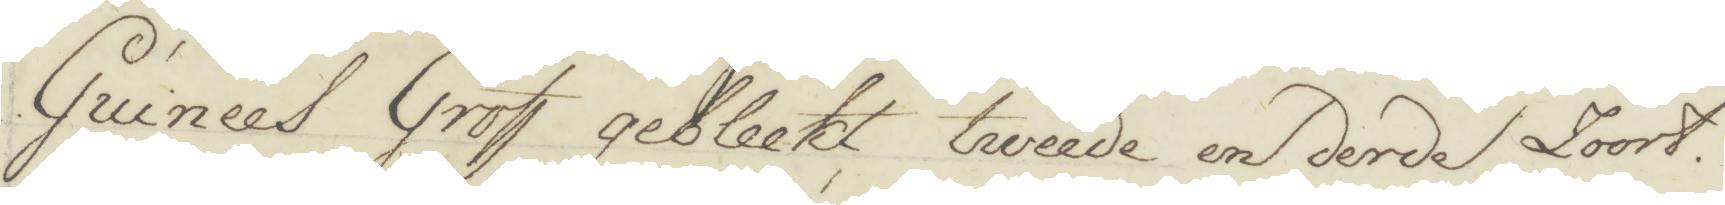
Guinees Groff gebleekt tweede en derde zoort.
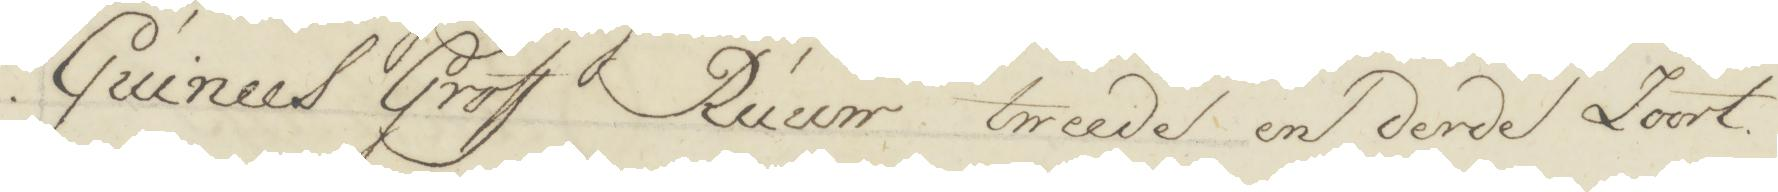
Guinees Groff Ruuw tweede en derde zoort.
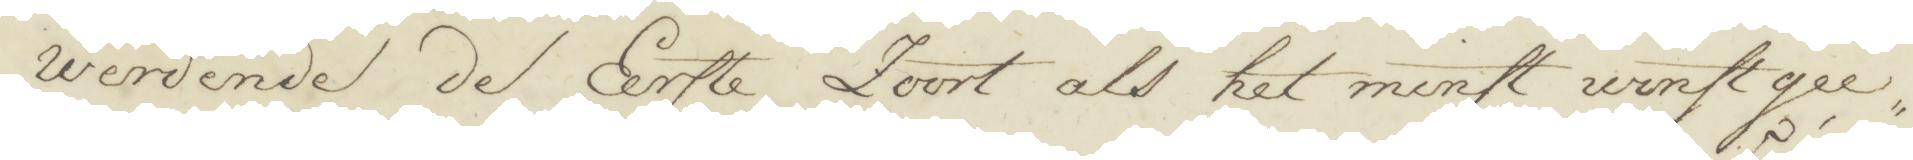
werdende de Eerste zoort als het minst winst gee„
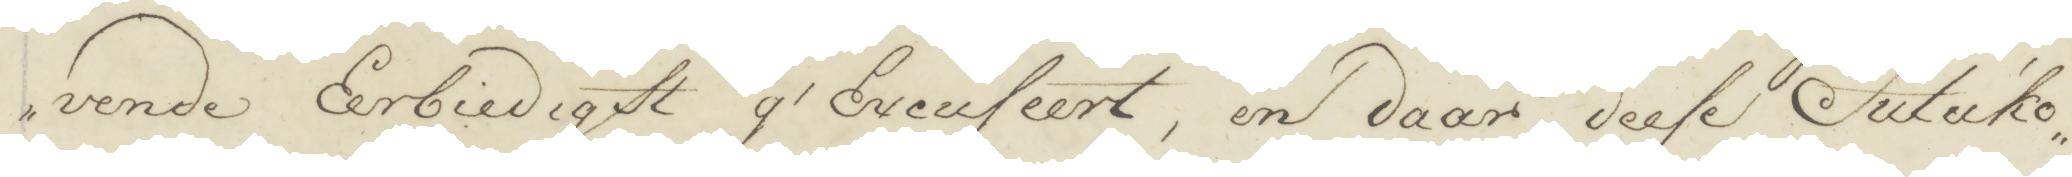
„vende Eerbiedigst g’Excuseert, en daar deese Tutuko„
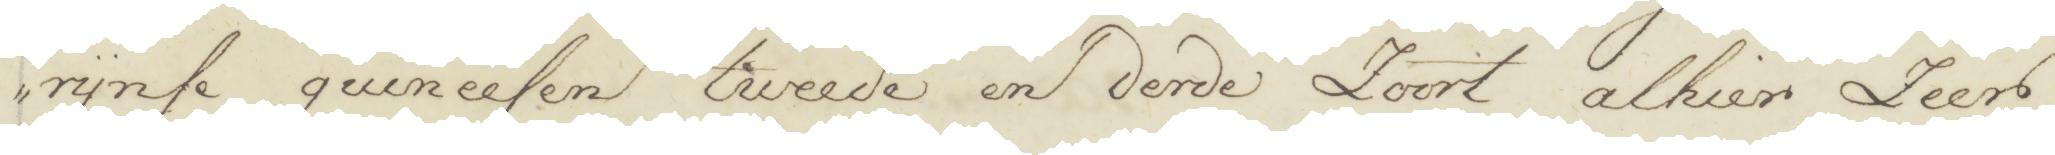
„rijnse guineesen tweede en derde zoort alhier zeer
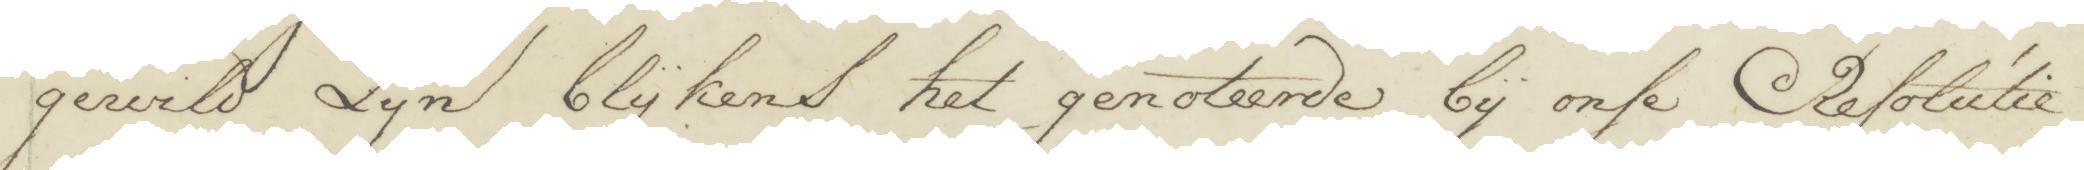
gewild zijn blijkens het genoteerde bij onse Resolutie
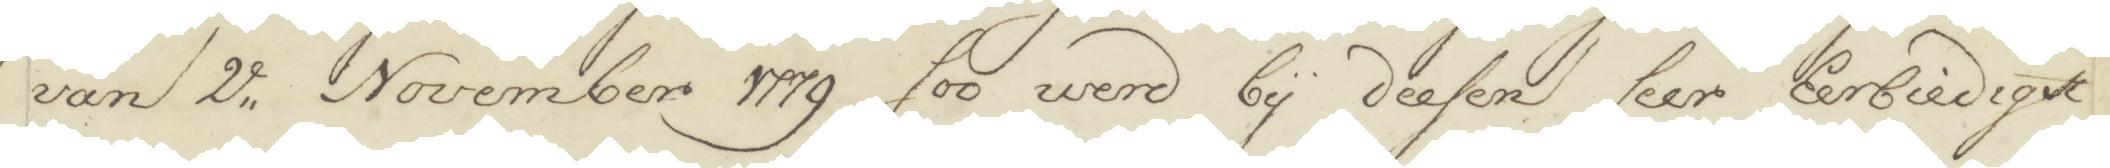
van 2„e November 1779 soo werd bij deesen seer Eerbiedigst
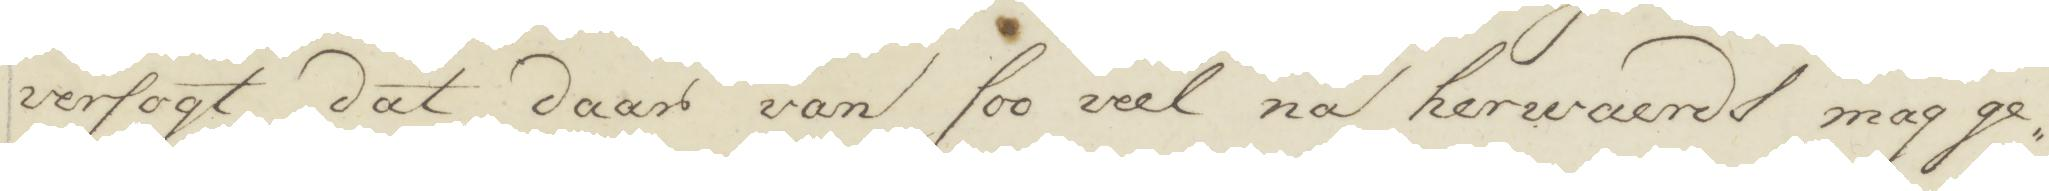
versogt dat daar van soo veel na herwaerds mag ge„
